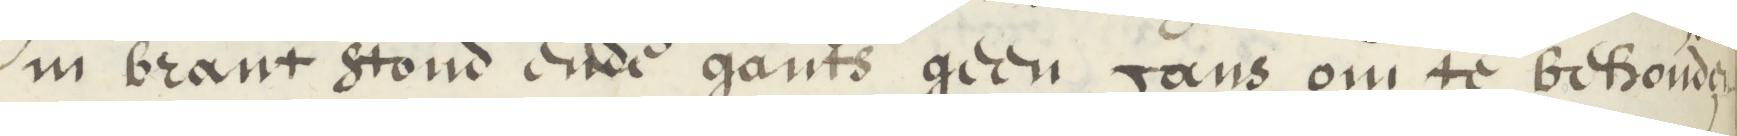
in brant stons ende gants geen cans om te behouden
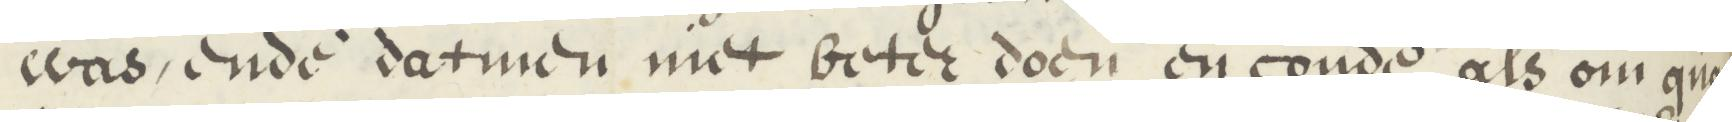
was, ende datmen niet beter doen en conde als om qua
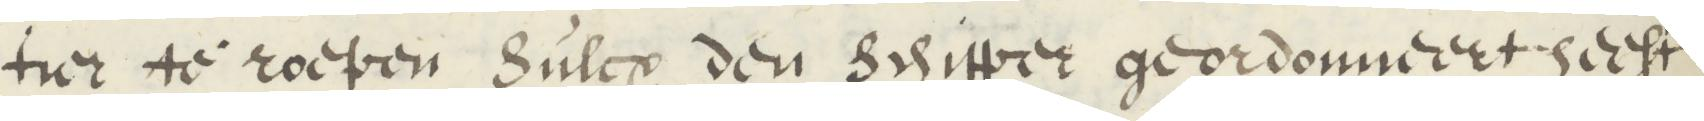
tier te roepen sulcx den schipper geordonneert heeft
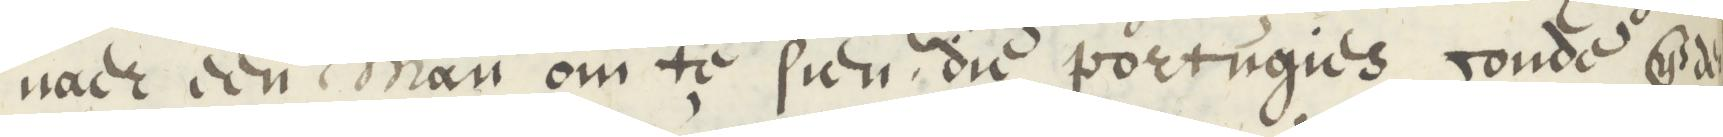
naer een man om te sien, die portugies soude ende de
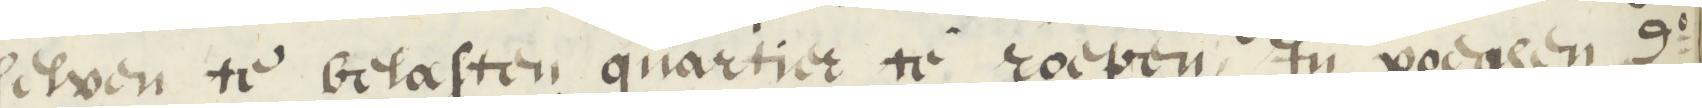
selven te belasten quartier te roepen, In voeghen d=o
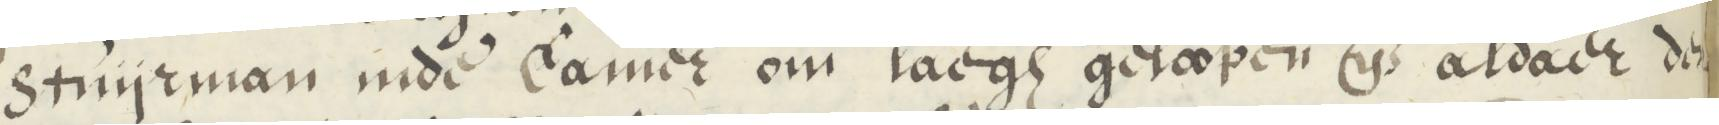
stuijrman inde Camer om laegh geloopen ende aldaer den
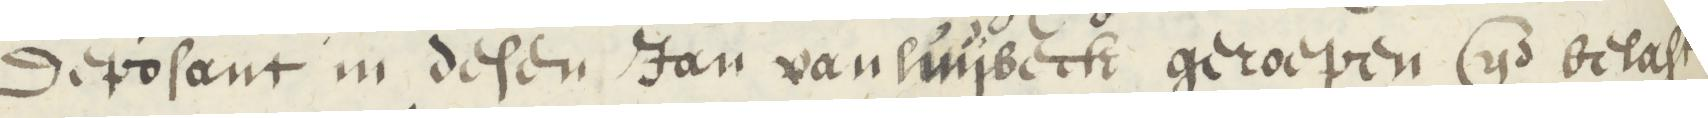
deposant in desen Ian van luijbeck geroepen ende belast
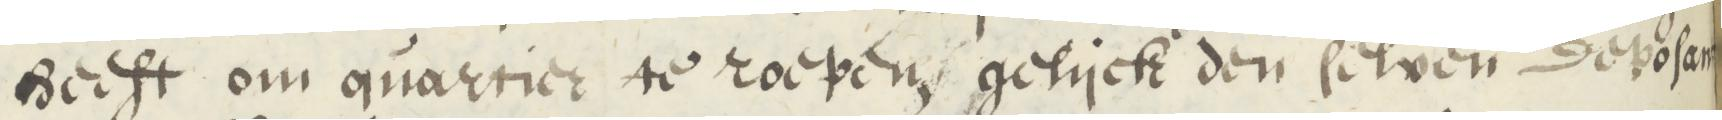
heeft om quartier te roepen gelijck den selven Deposan
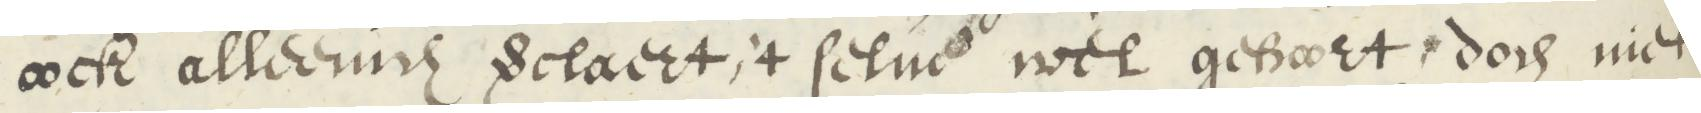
oock alleenich verclaert, ’t selve wel gehoort, doch niet
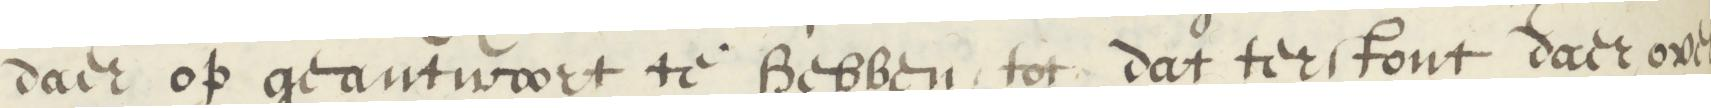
daer op geantwoort te hebben, tot dat terstont daer over
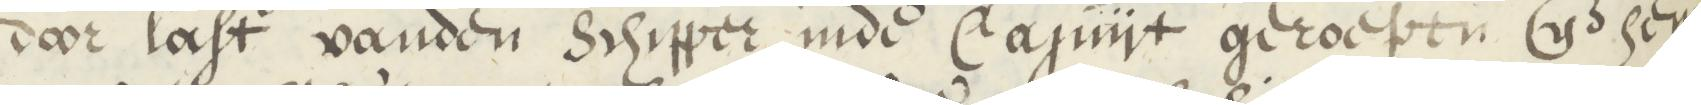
door last vanden schipper inde Cajuijt geroepen ende hem
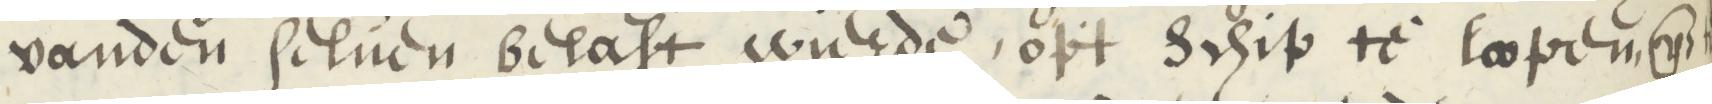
vanden seluen belast wierde, op't schip te lopen ende
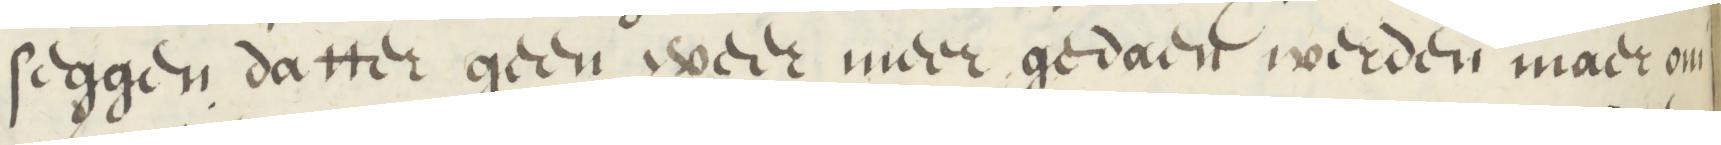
seggen datter geen weer meer gedaen werden maer om
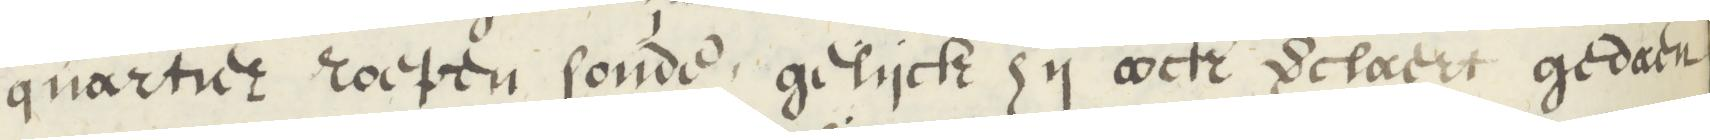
quartier roepen soude, gelijck hij oock verclaert gedaen
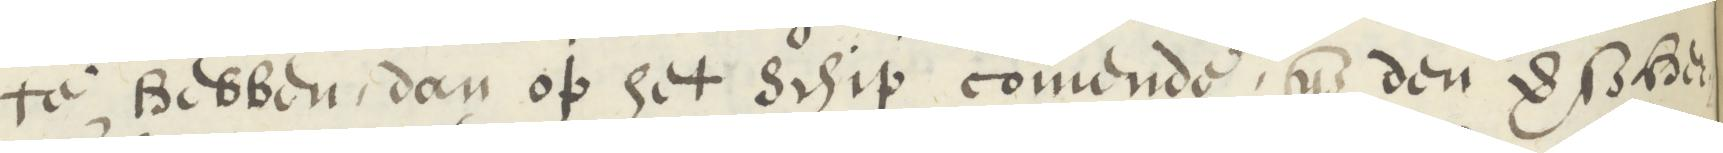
te hebben, dan op het schip comende, ende den versz her„
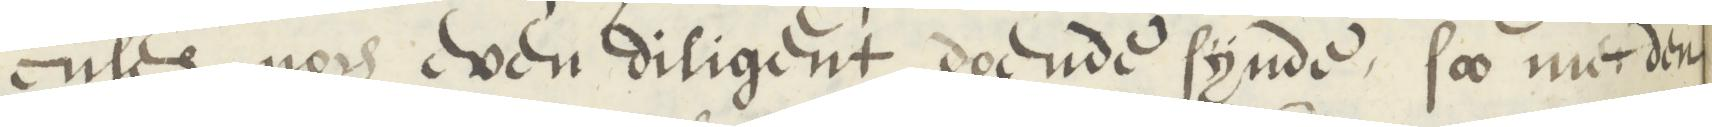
cules noch even diligent doende sijnde, soo met den
